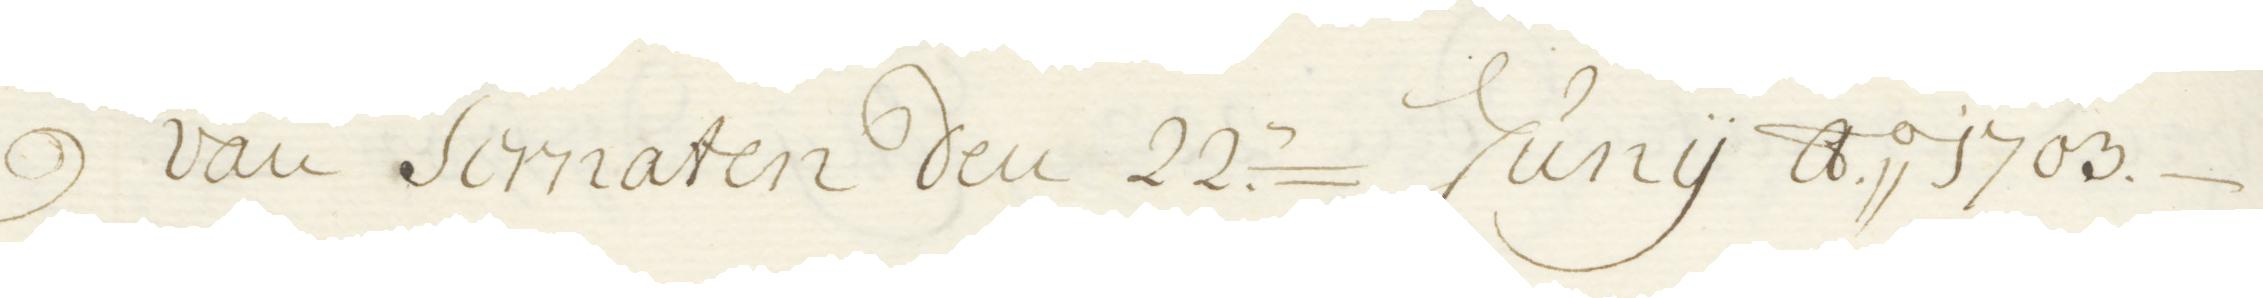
van Ternaten den 22=' Junij A.„o 1703. —
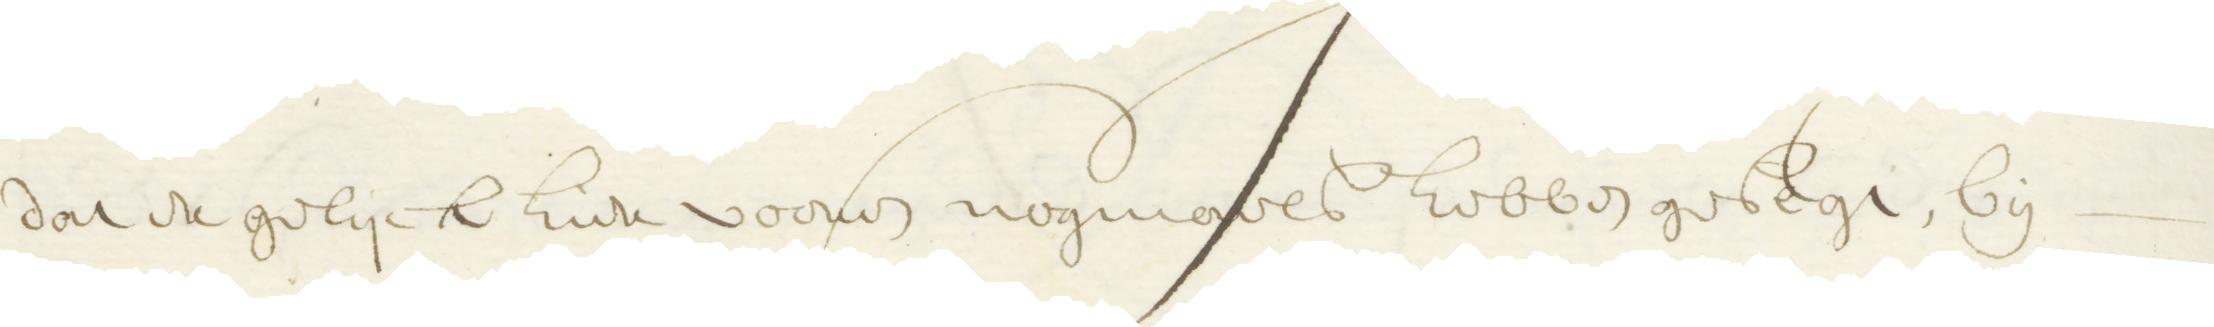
dat er gelijck hier vooren nogmaels hebben gesegt, bij —
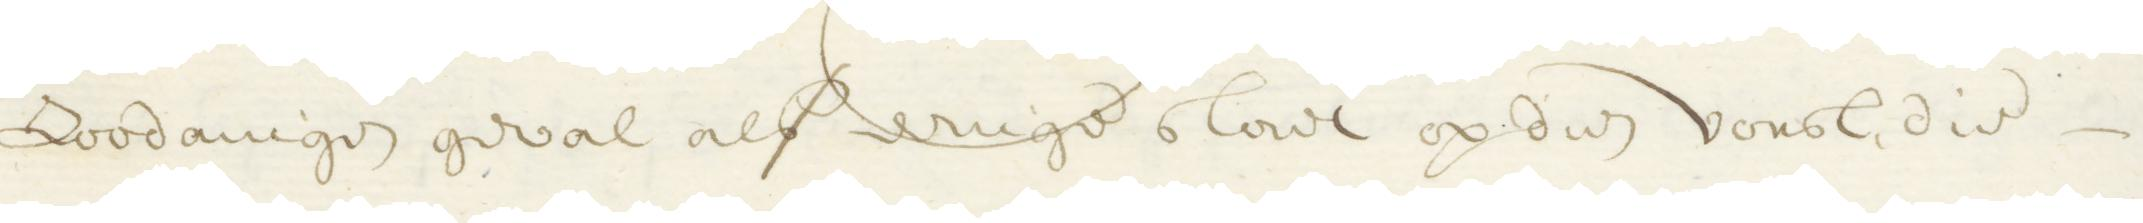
zoodanigen geval als eenige staet op dien vorst, die —
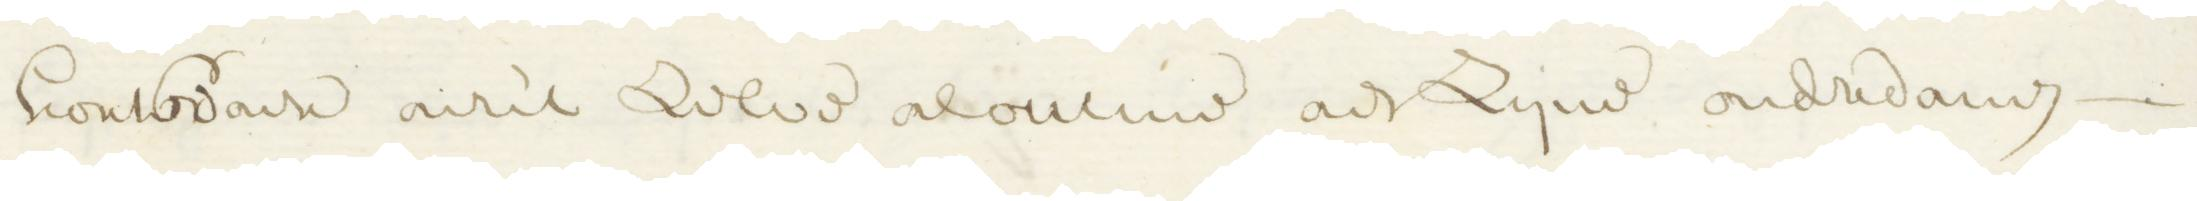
kortsdaer aen't zelve alomme aen zijne onderdanen —
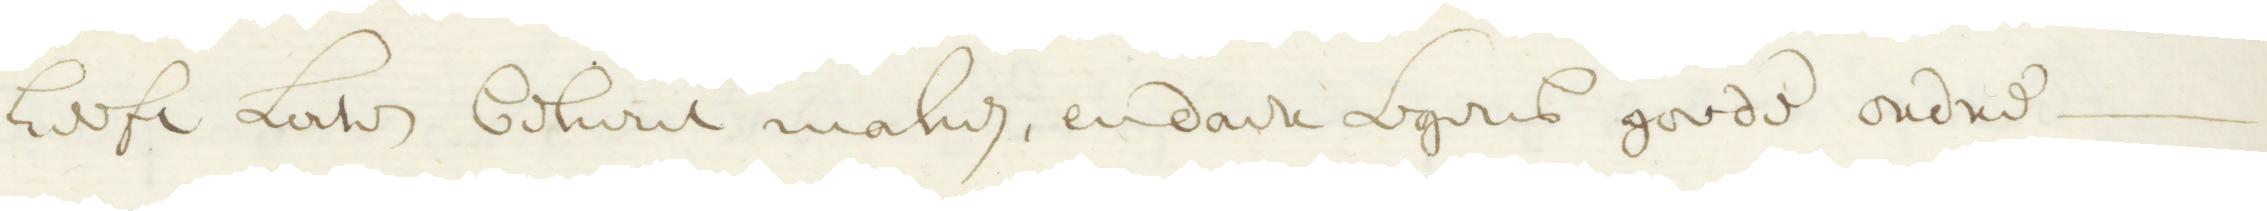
heeft laten bekent maken, en daer tegens goede ordre —
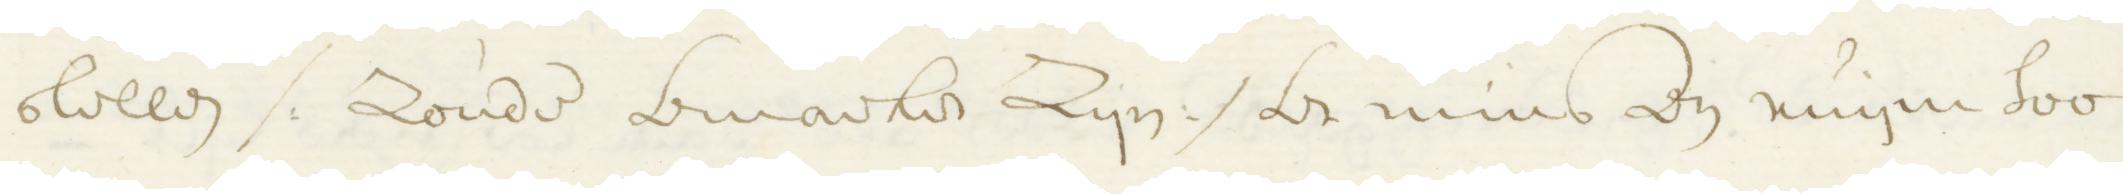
stellen /:zoude temaeken zijn:/ ten minsten ruijm soo
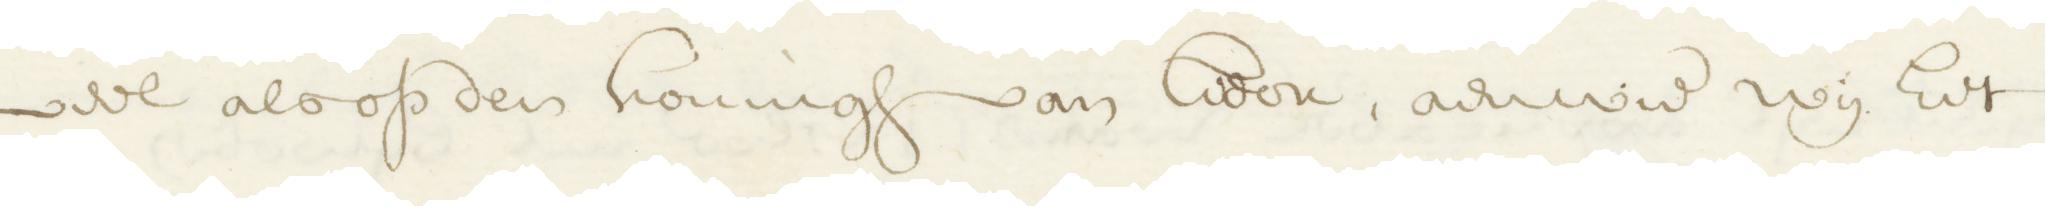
veel als op den koningh van Tidor, aenwie wij het
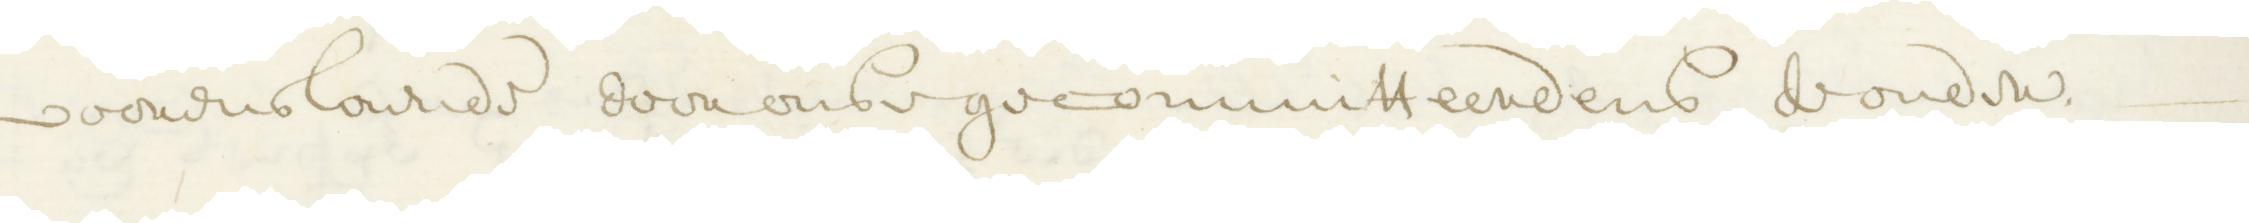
voorenstaende door onse gecommitteerdens de onder
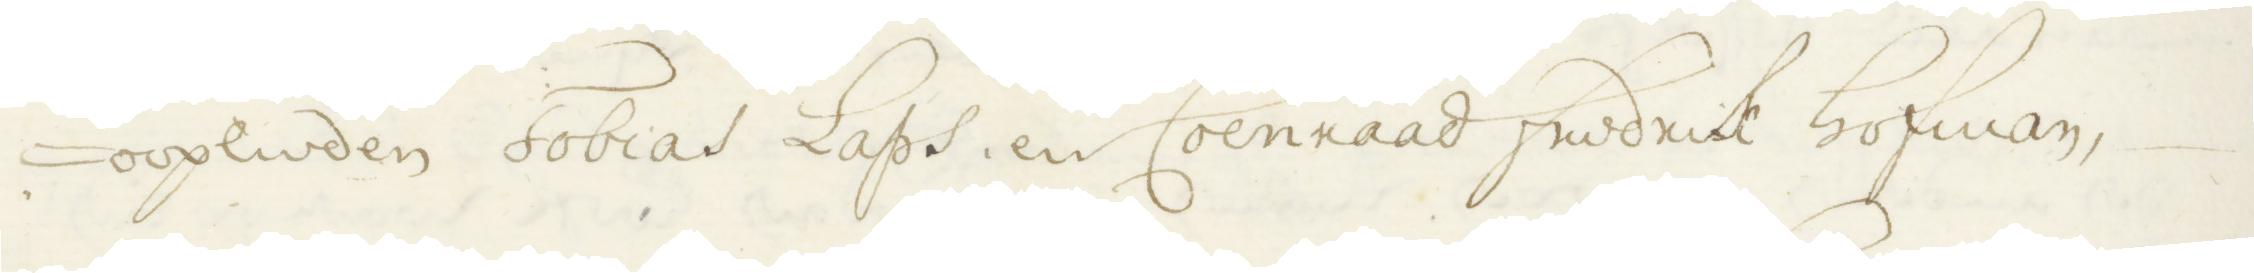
cooplieden Tobias Laps, en Coenraad fredrik hofman,
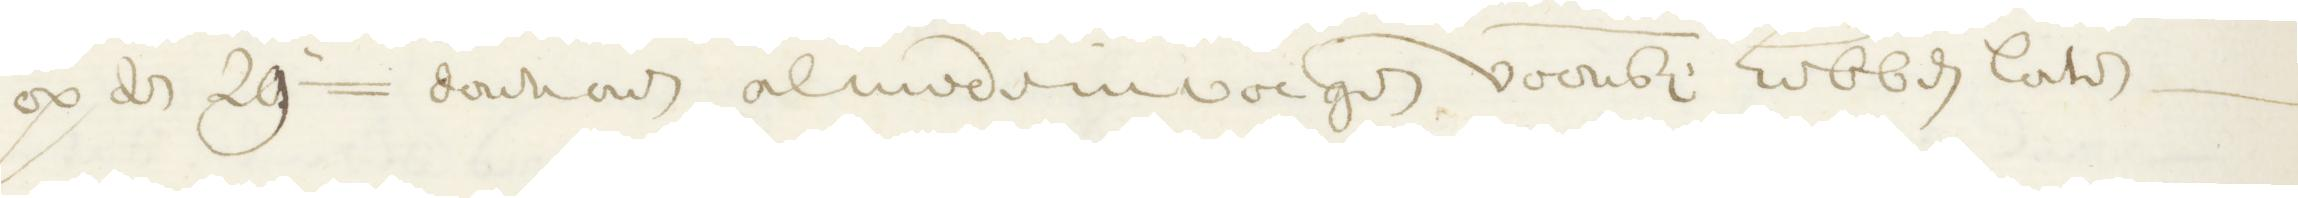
op den 29=' daeraen almede involgen voorsz hebben laten —
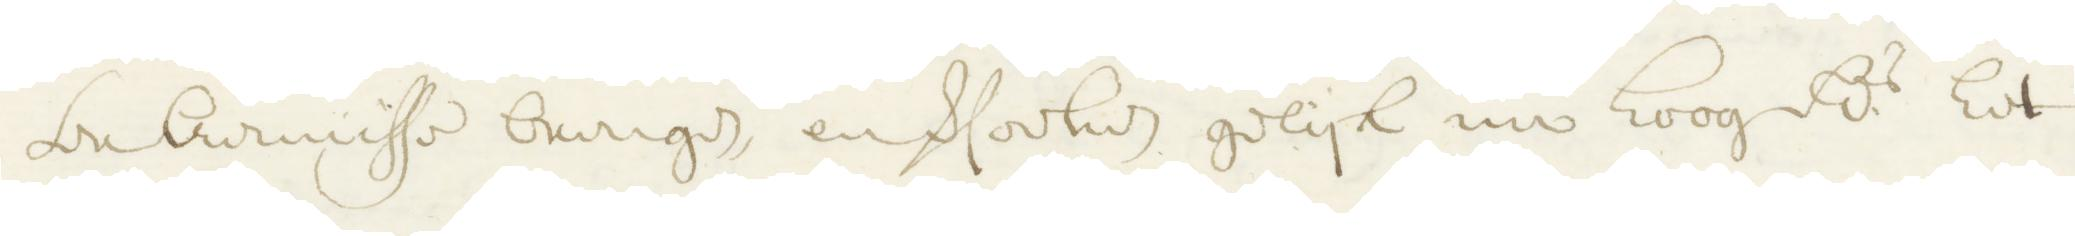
ter kennisse brengen, en versoeken gelijk uw hoog Ed:s het
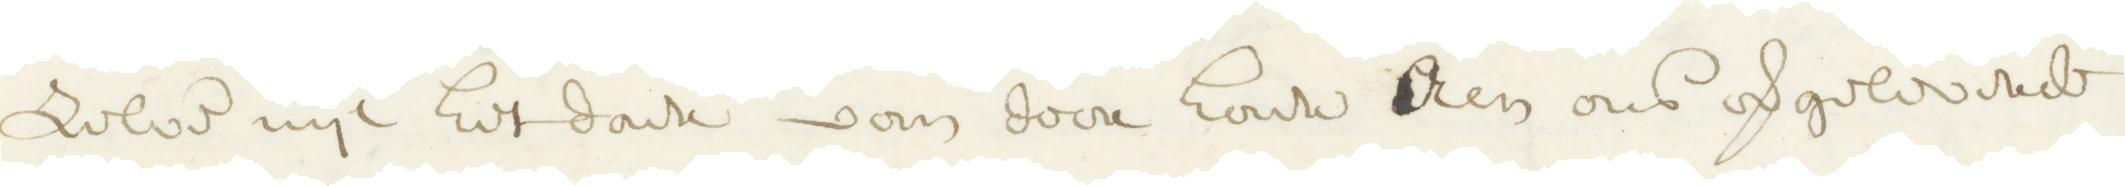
zelve uijt het daer van door haer aen ons overgeleverde
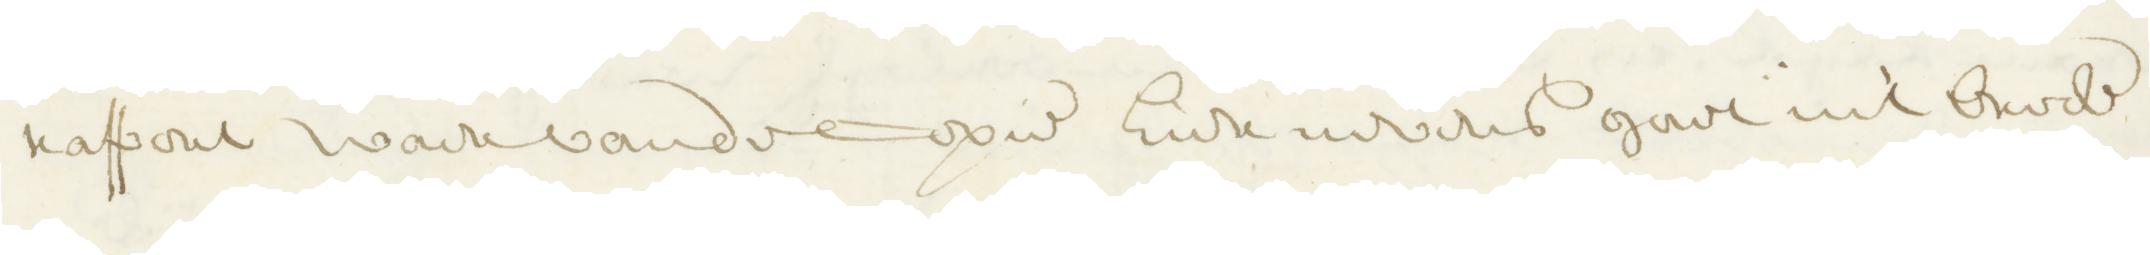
rapport waer van de copie hier nevens gaet in’t brede
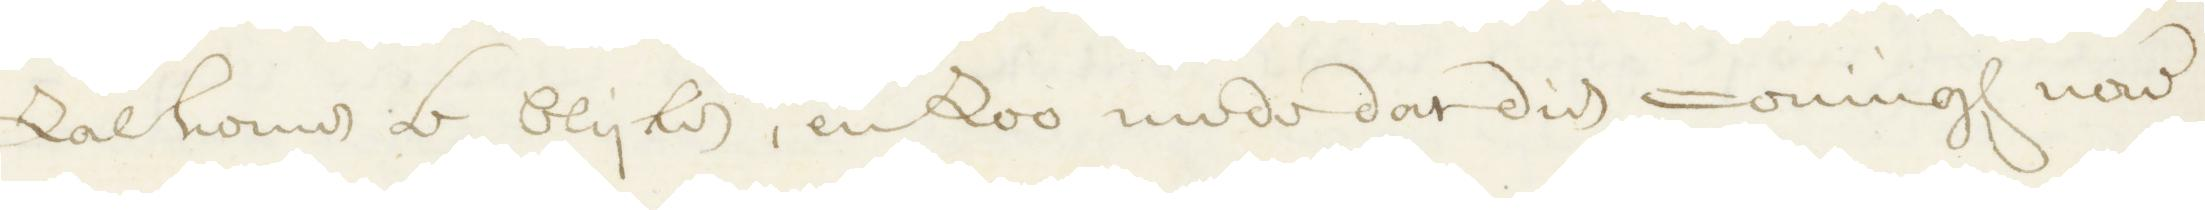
zal komen te blijken, en zoo mede dat dien coningh nae
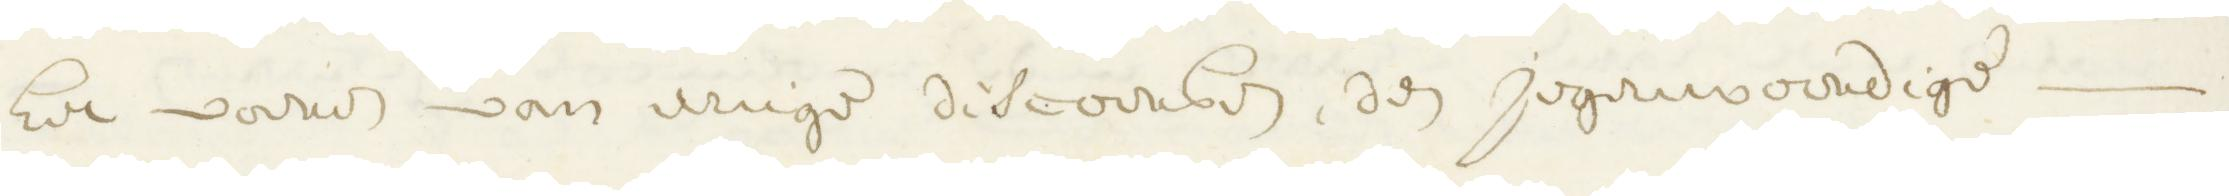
het voeren van eenige discoersen, den jegenwoordige —
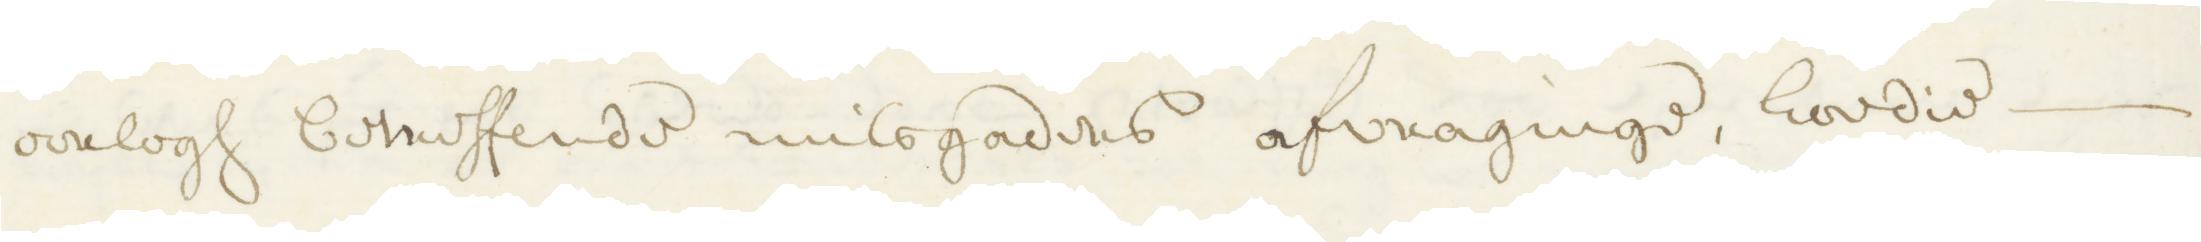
oorlogh betreffende mitsgaders afvraginge, hoe die —
